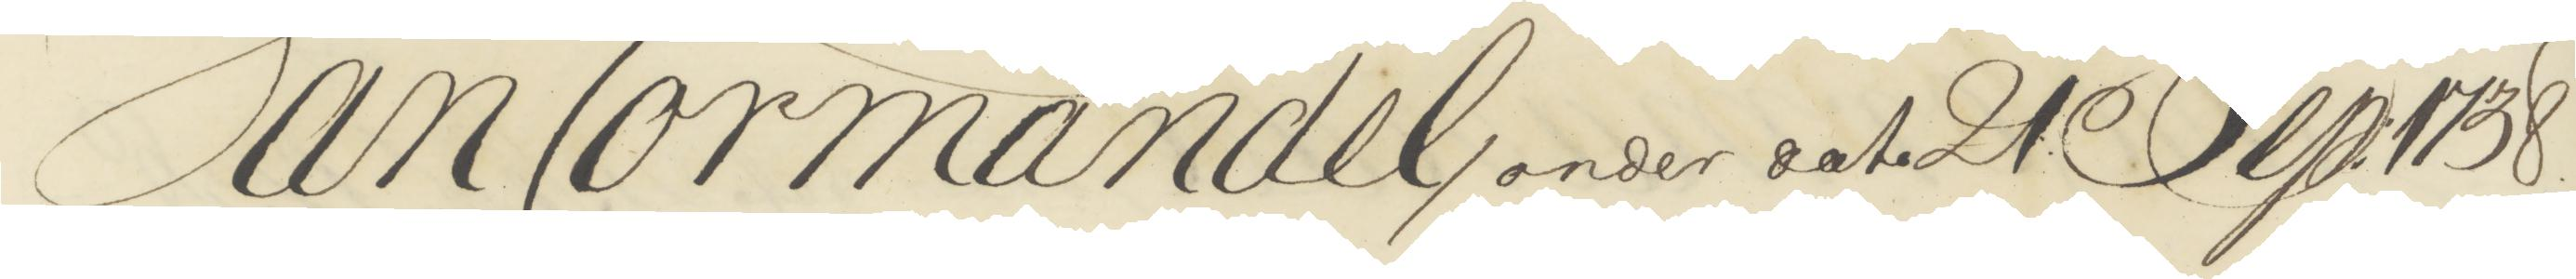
Van Cormandel, onder dato 21: Sep: 1738
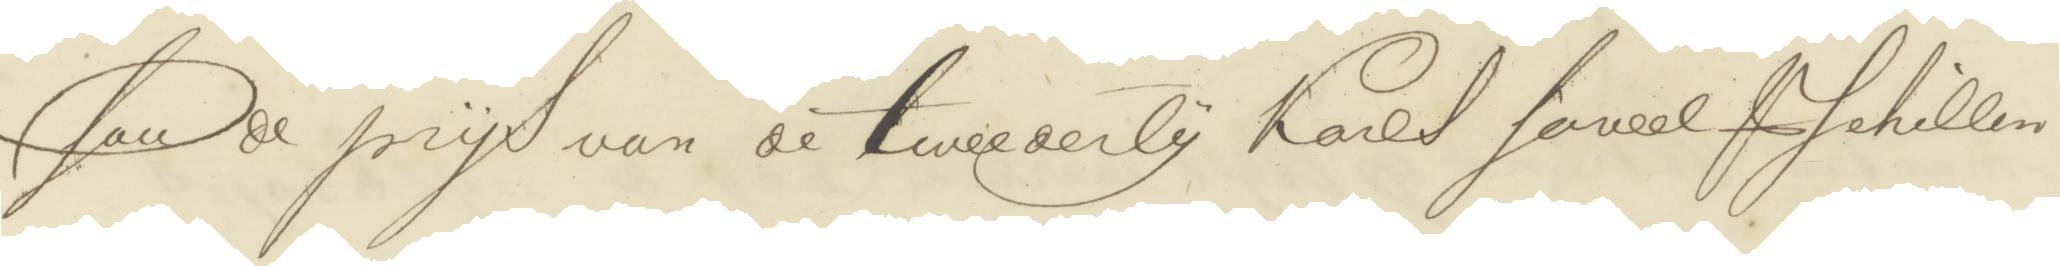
san de prijs van de tweederlij korls soveel verschillen
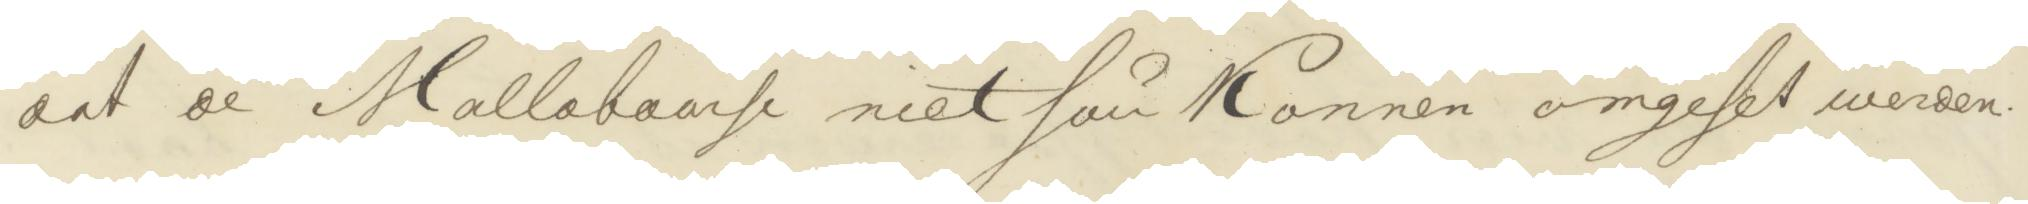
dat de Mallabaarse niet sou konnen omgeset werden
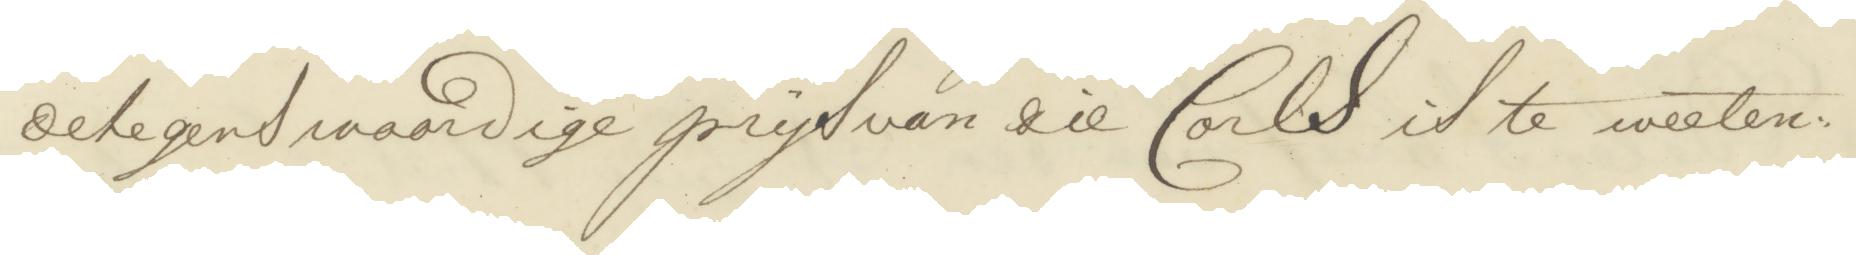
de tegens woordige prijs van die Corls is te weeten:
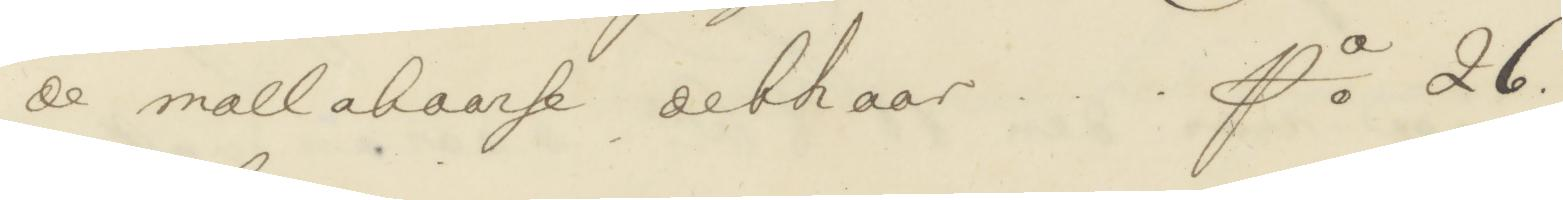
de mallabaarse de bhaar . . . p a/o 26.
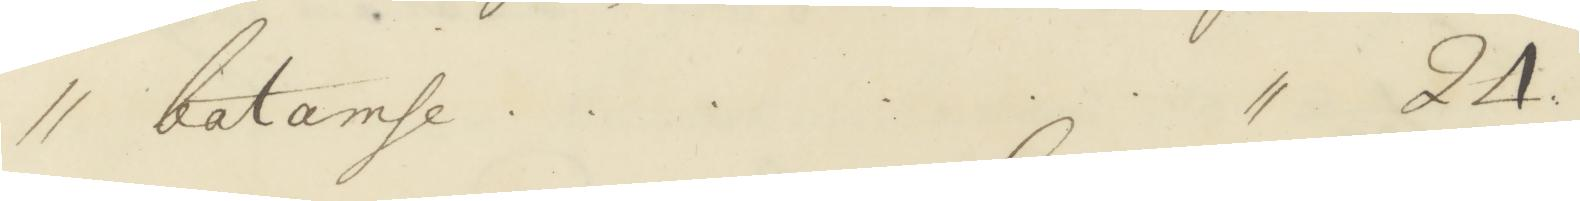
„ batamse . . . . . . „ 24:
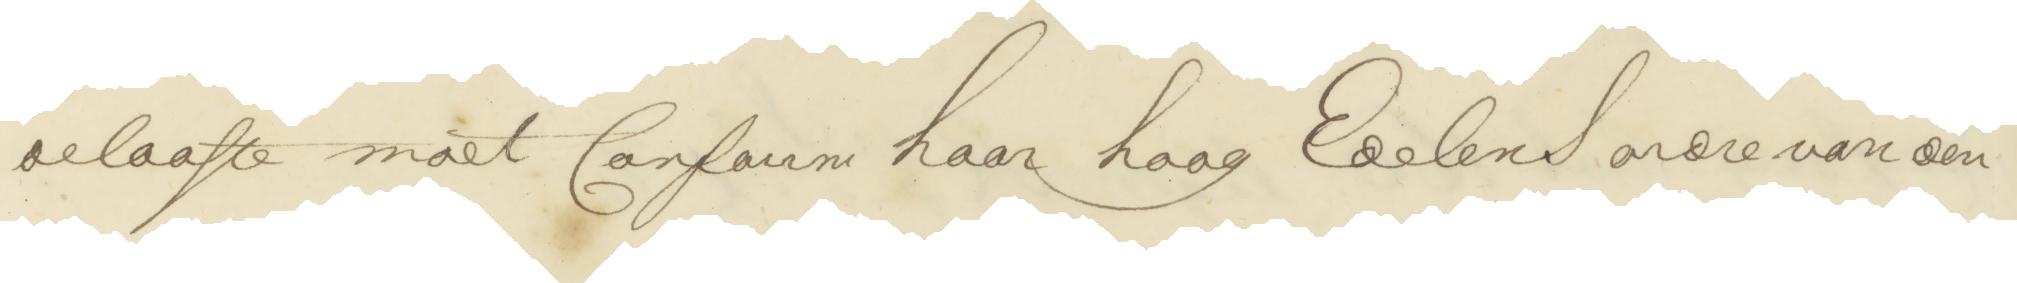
de laaste moet Conform haar hoog Edelens ordre van den
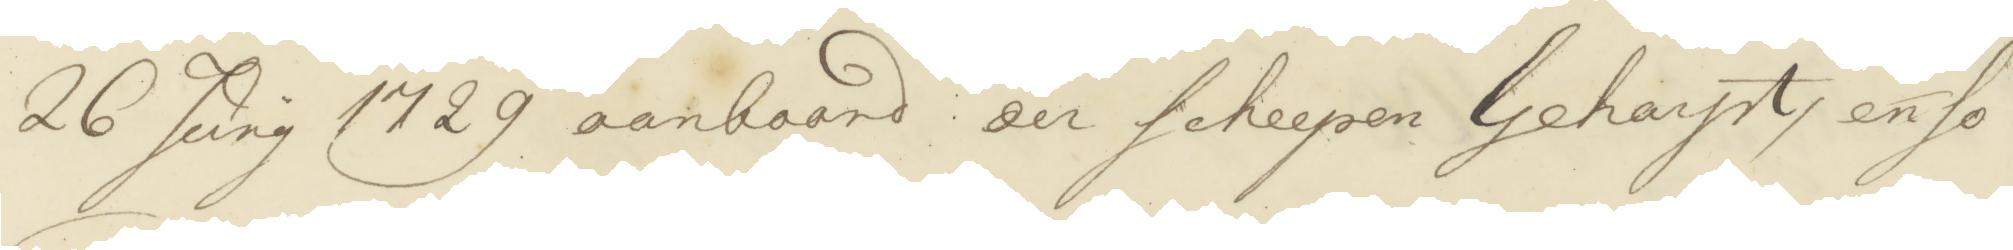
26 Junij 1729 aanboord der scheepen Gehayst, en so
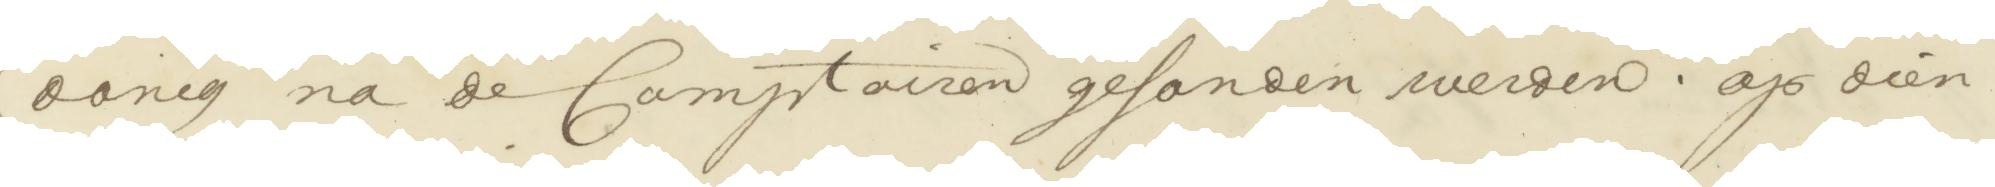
danig na de Comptoiren gesonden werden op dien
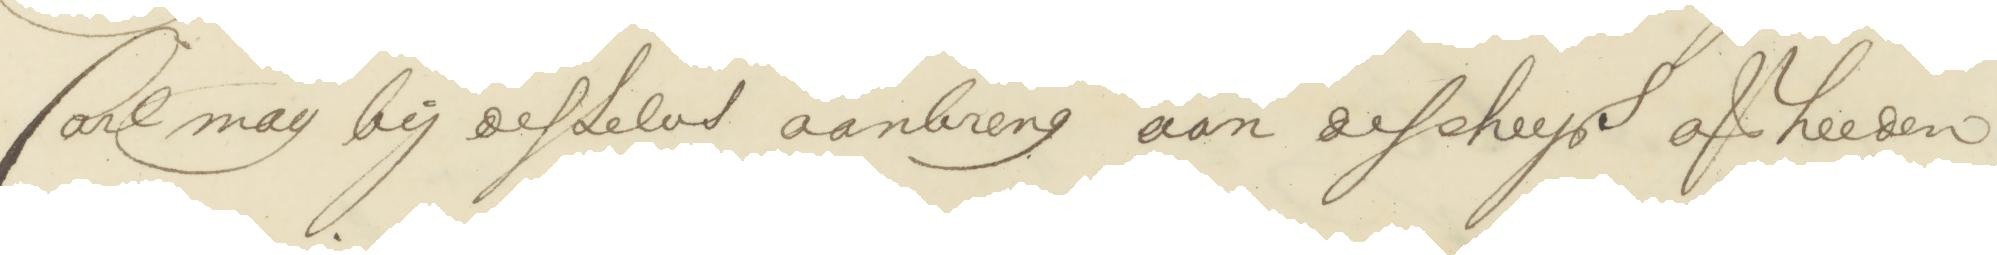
Corl mag bij desselvs aanbreng aan descheeps over heeden
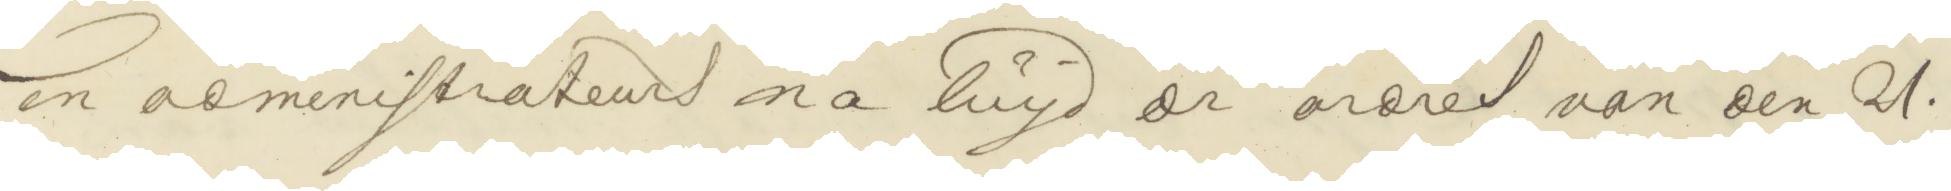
en administrateurs na luijd de ordres van den 21.
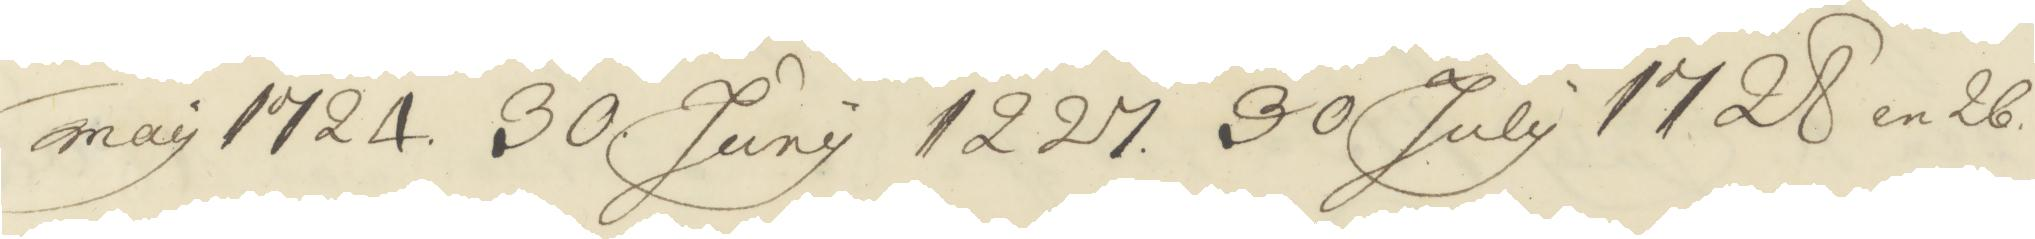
maij 1724. 30. Junij 1227. 30 Julij 1728 en 26.
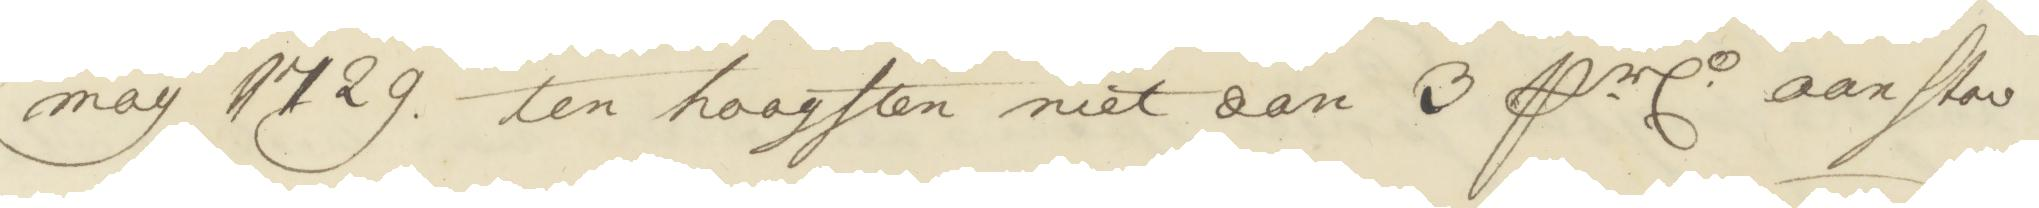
maij 1729. ten hoogsten niet dan 3 p.rC.o aan stov
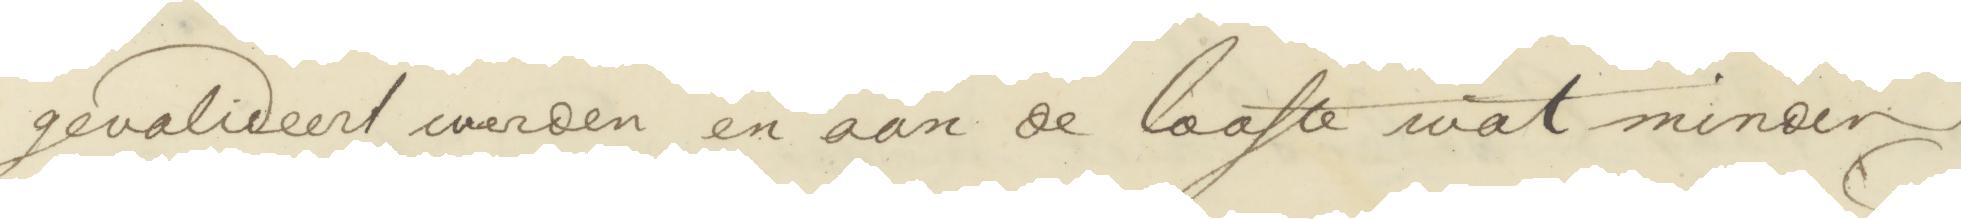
gevalideert werden en aan de laaste wat minder
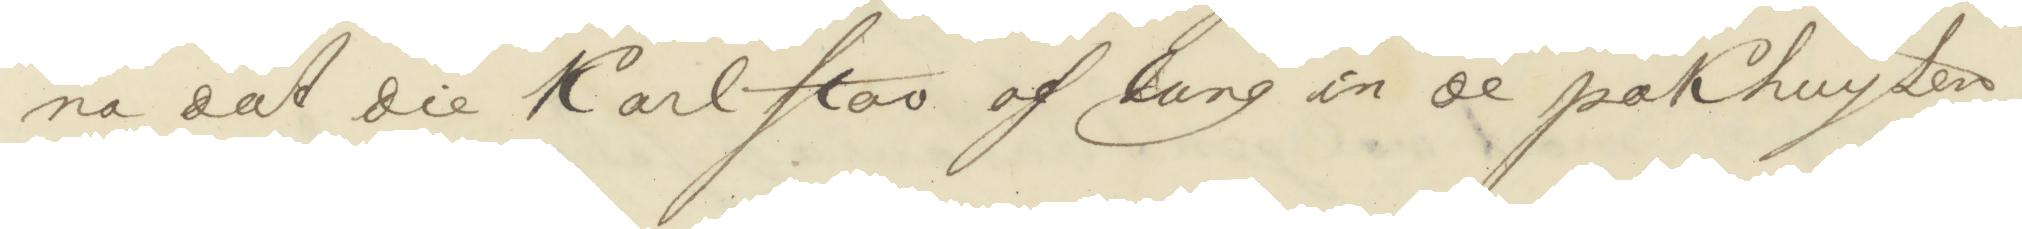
na dat die Korl stov of lang in de pakhuijsen
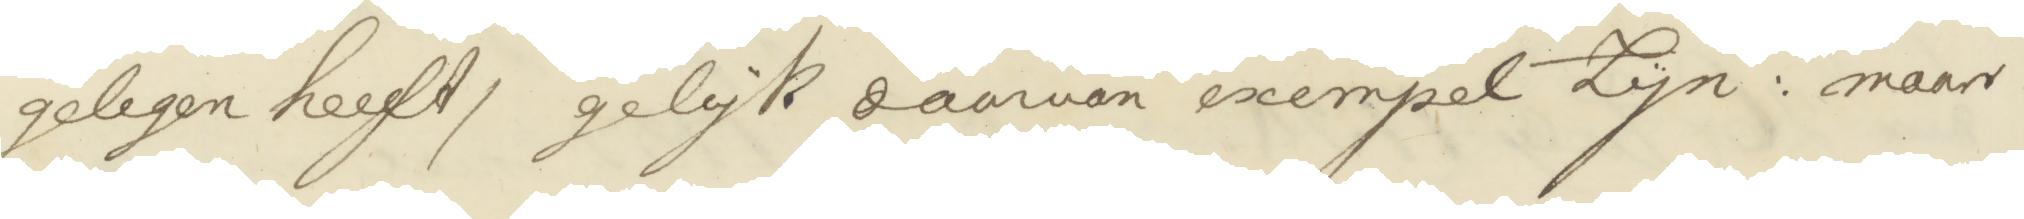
gelegen heeft, gelijk daarvan exempel zijn: maar
